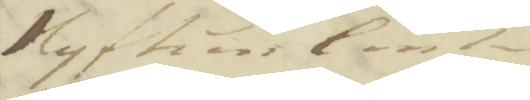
Vyftien Cent
